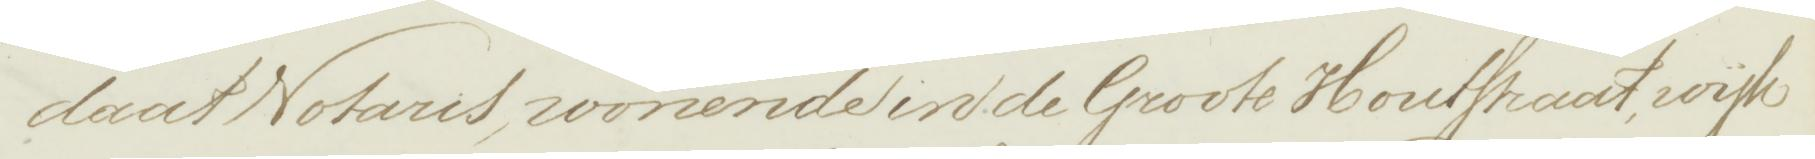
daat Notaris, wonende in de Groote Houtstraat, wijk
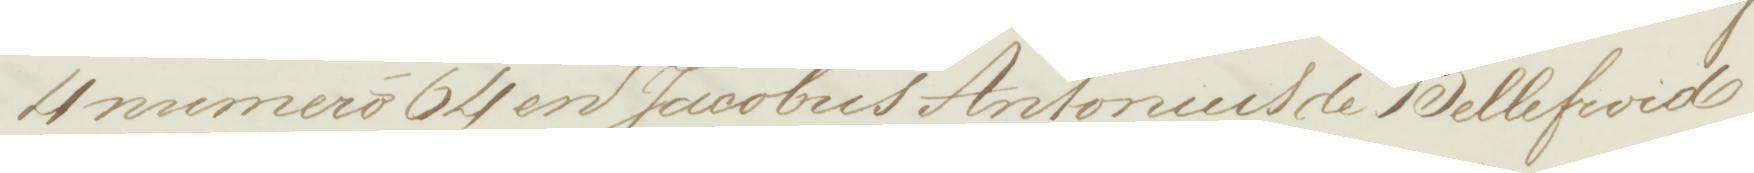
4 numero 64 en Jacobus Antonius de Bellefroid
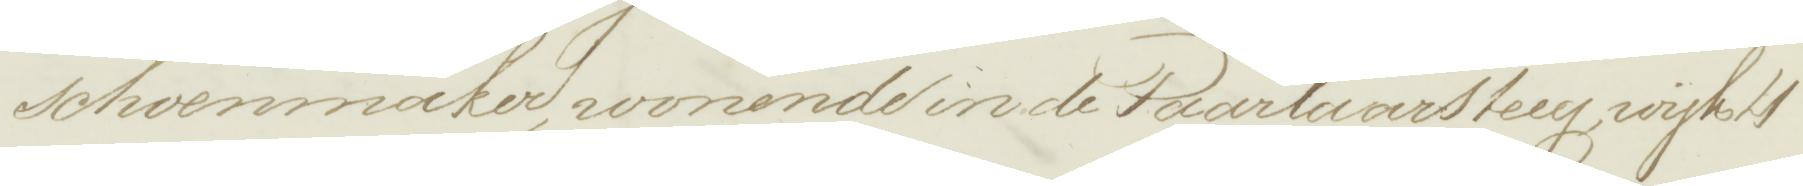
schoenmaker, wonende in de Paarlaarsteeg wijk 4
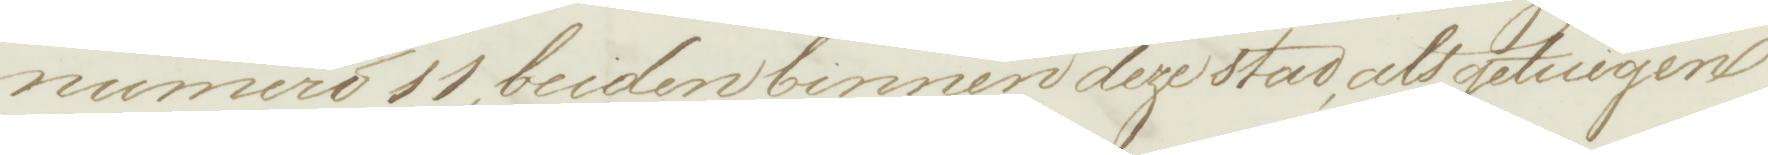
numero 11, beiden binnen deze stad, als getuigen
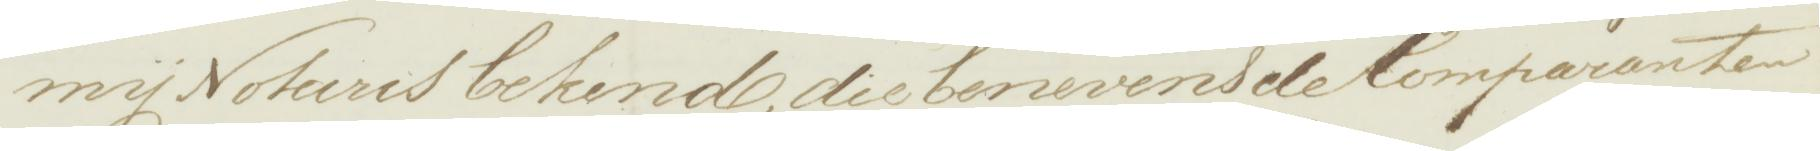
mij Notaris bekend, die benevens de Comparanten
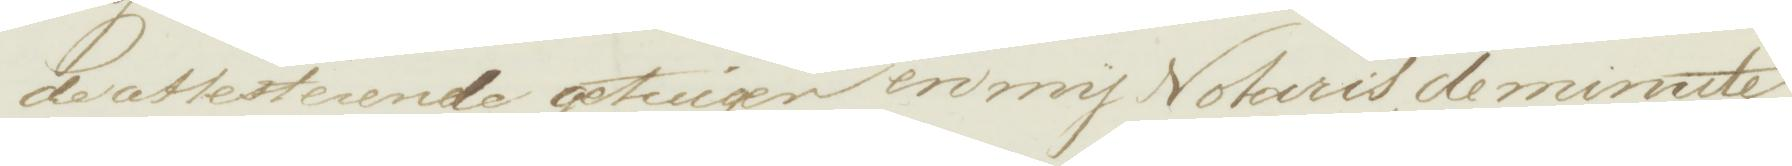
de attesterende getuigen en mij Notaris, de minute
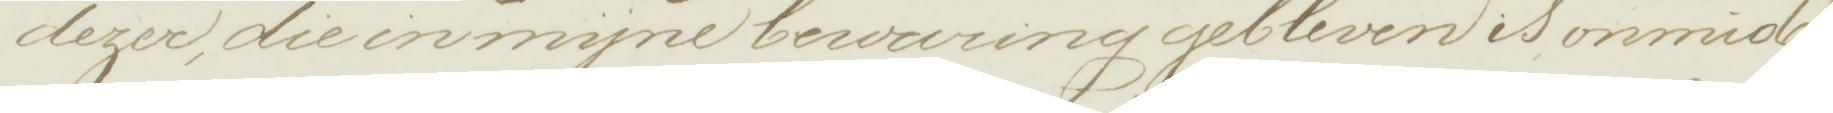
dezer, die in mijne bewaring gebleven is, onmid
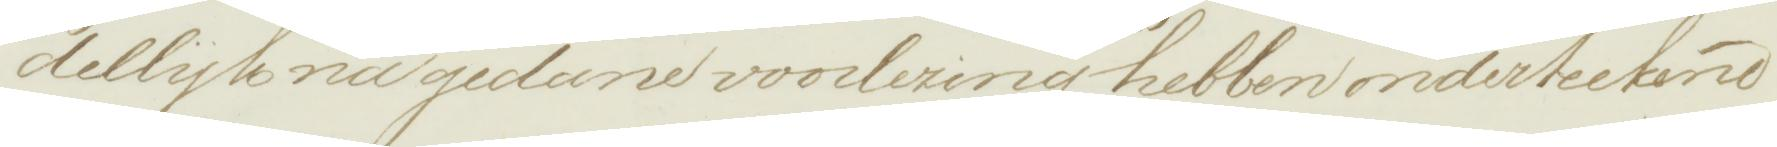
dellijk na gedane voorlezing hebben onderteekend
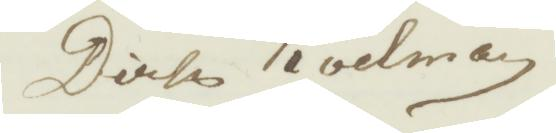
Dirk Koelman
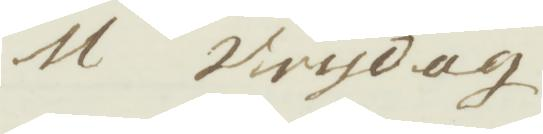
M Vrydag
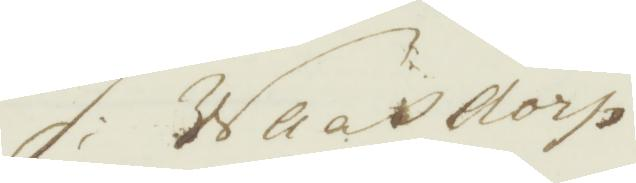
J: Waasdorp
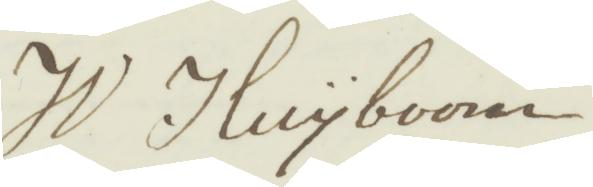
W Huijboom
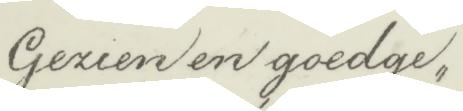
Gezien en goedge„
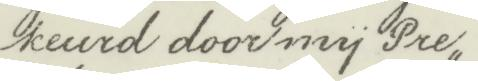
keurd door mij Pre„
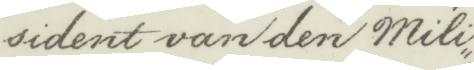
sident van den Mili„
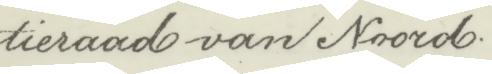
tieraad van Noord.
